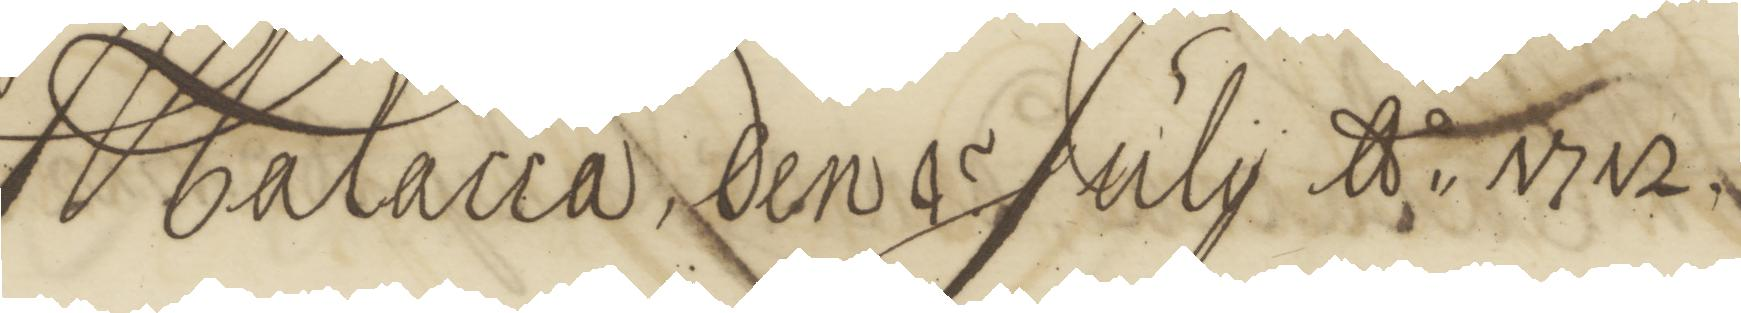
Malacca, den 4.' Julij A„o 1712.
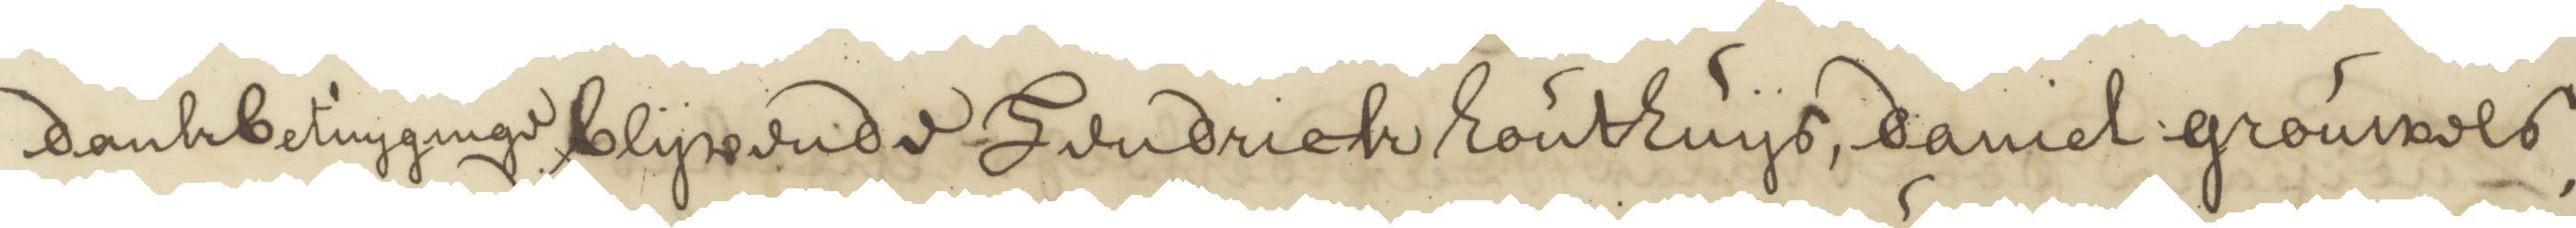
dankbetuijginge blijvende Hendrick Houthuijs, daniel grouwels
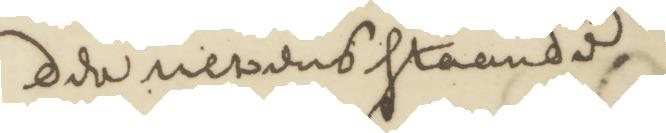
der nevens staande
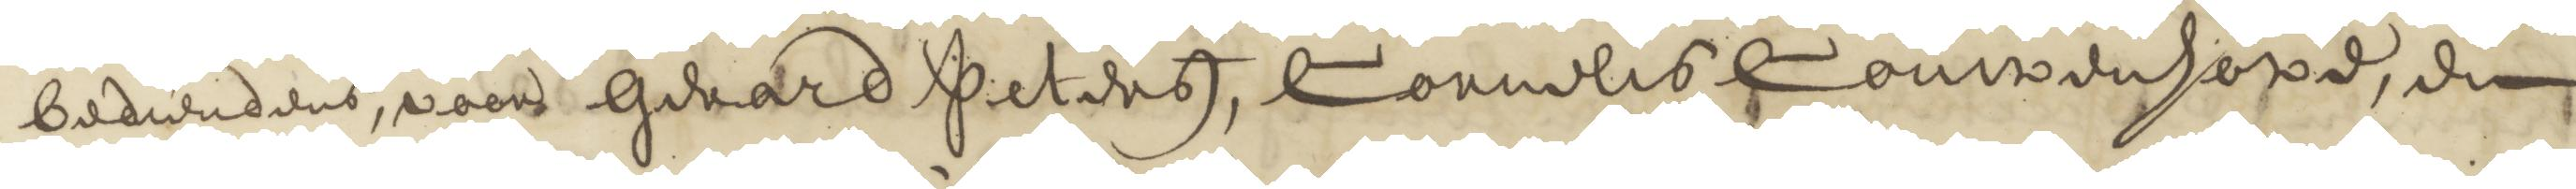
bediendens, voor gerard Pieters, Cornelis Couwenhove, en
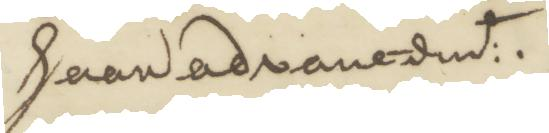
haar advancem:t.
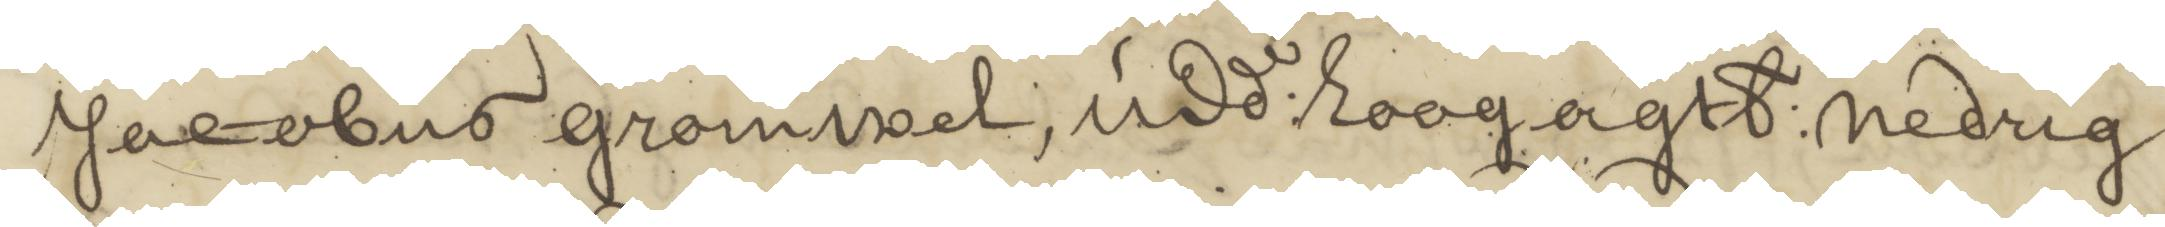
Jacobus gromwel, u Ed:e hoog agtb: nedrig
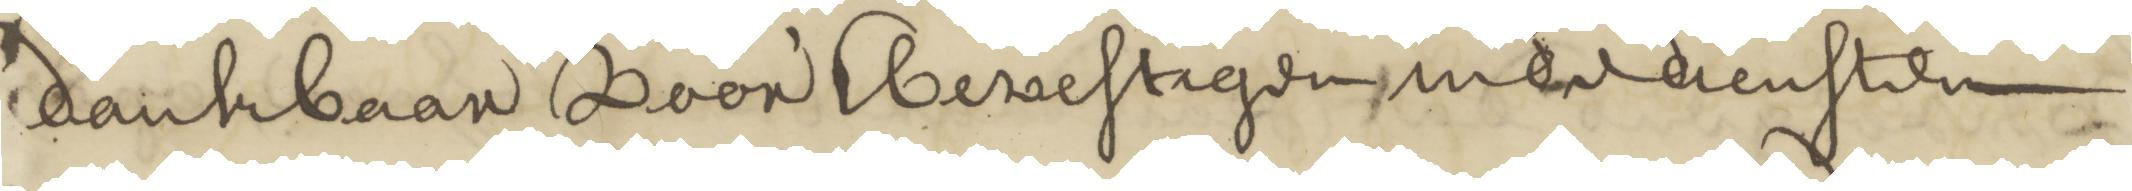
dankbaar voor 't bevestigen, in de diensten
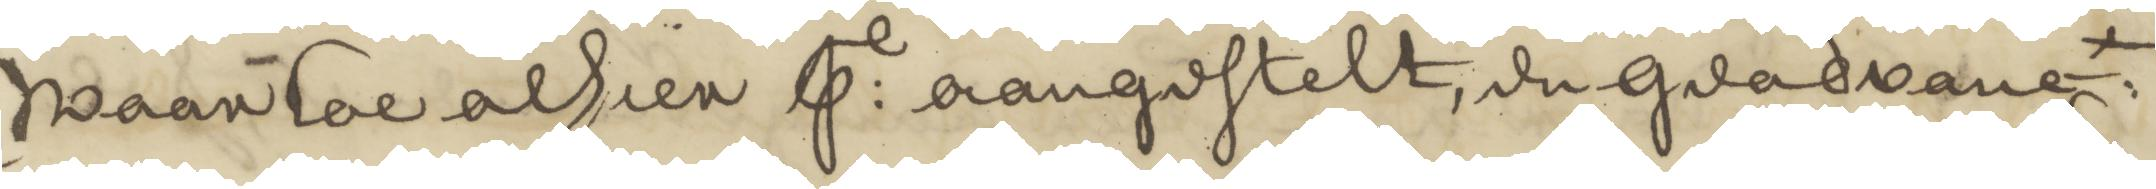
waar toe alhier p:l aangestelt, en geadvanc:t
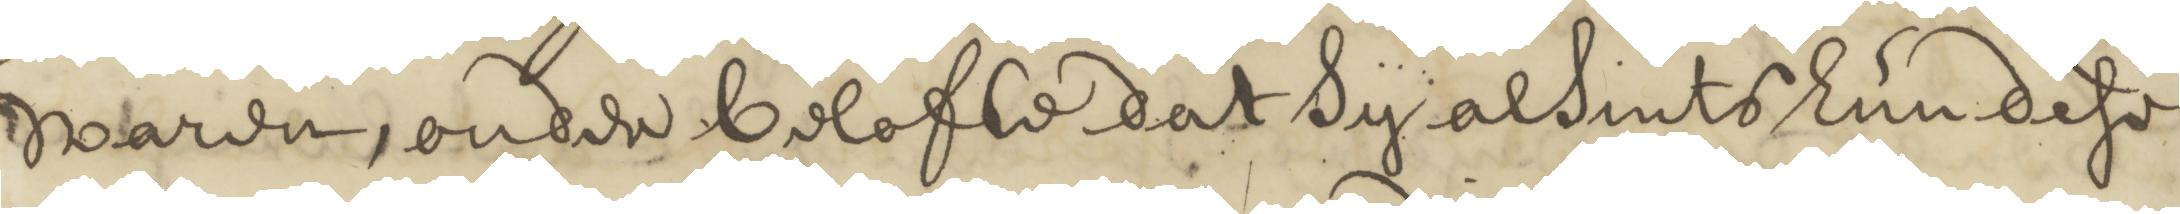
waren, onder belofte dat Sij alsints hun dese
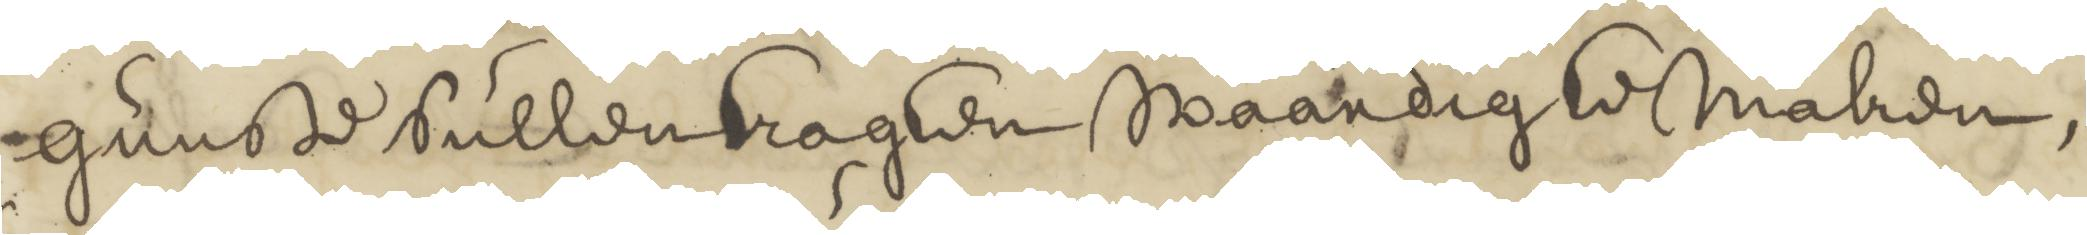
gunste sullen tragten waardig te maken
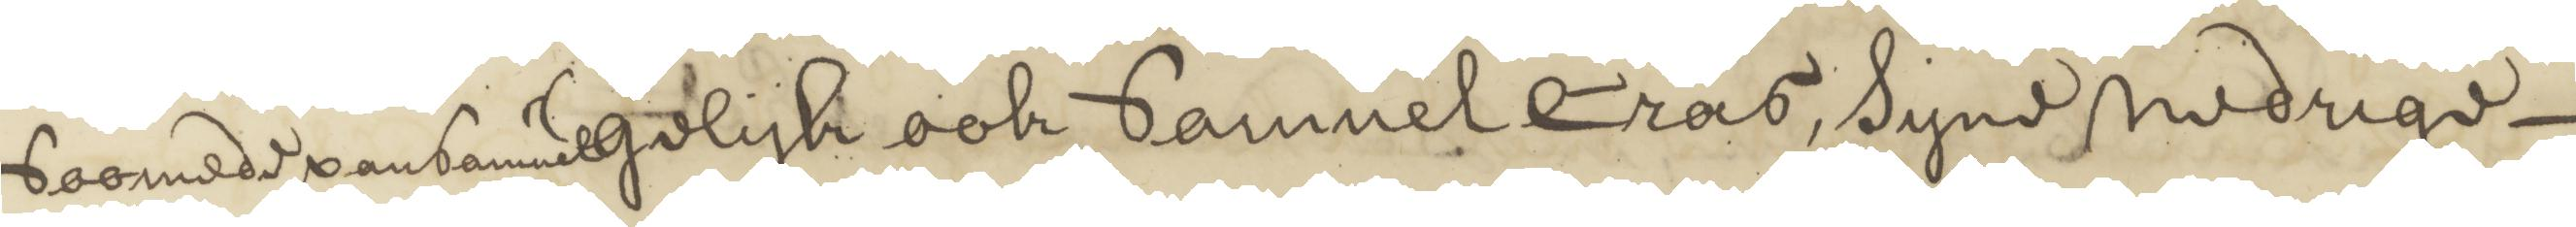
soomede van samuel gelijk ook Samuel Cras, sijne nedrige —
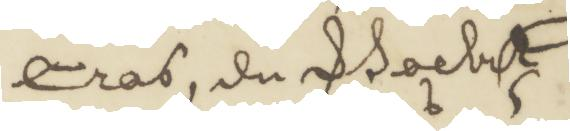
Cras, en versoekt
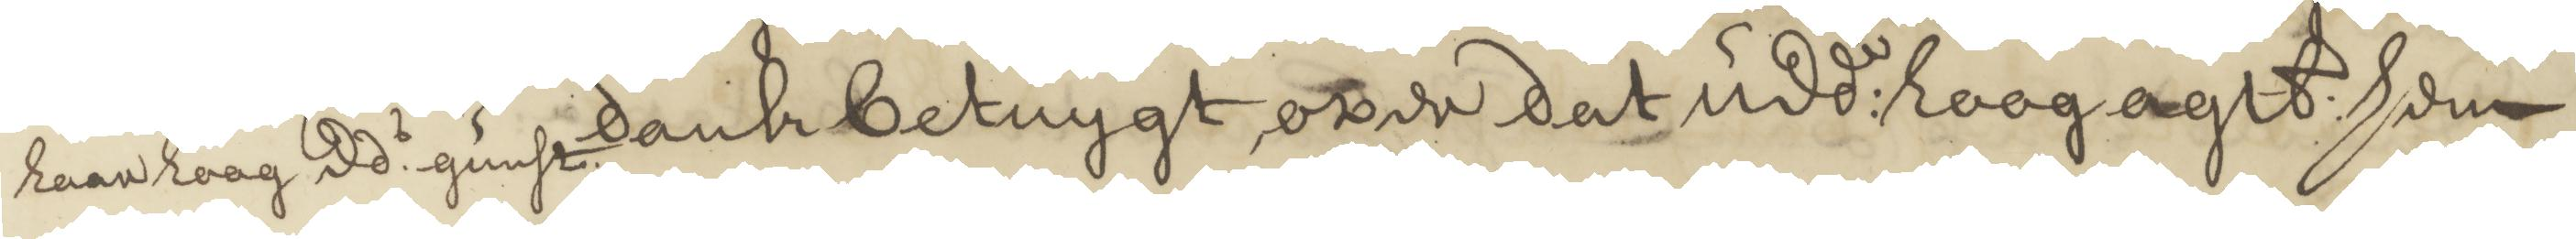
haar hoog Ed:s gunst. dank betuijgt, over dat u Ed:e hoog agtb: hem
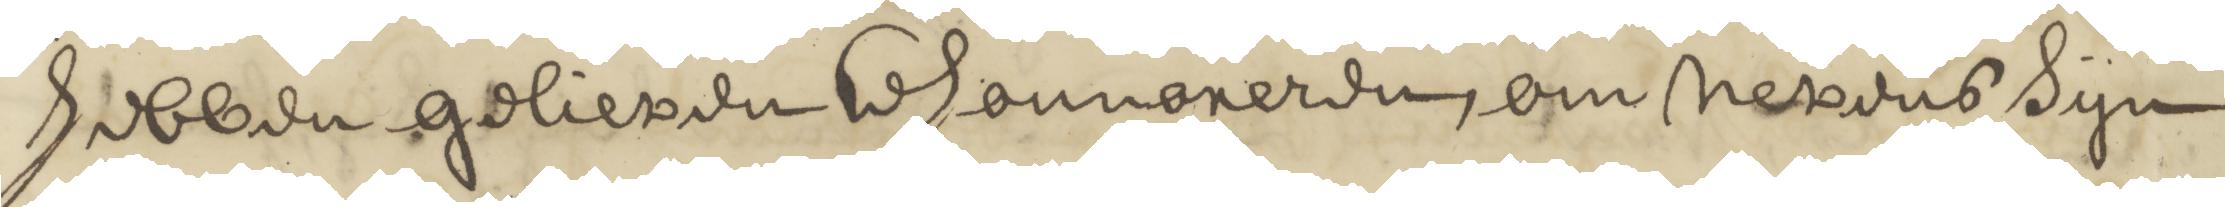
hebben gelieven te honnoreren, om nevens sijn
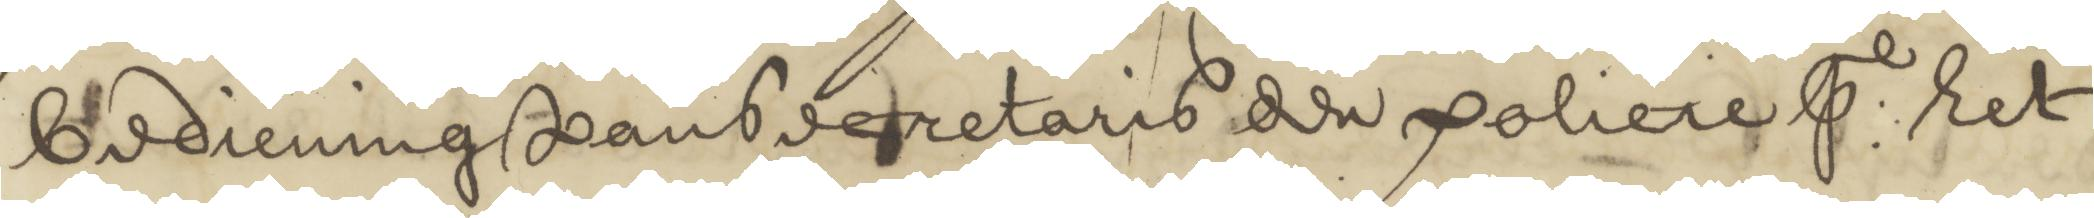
bediening van secretaris der policie p:l het
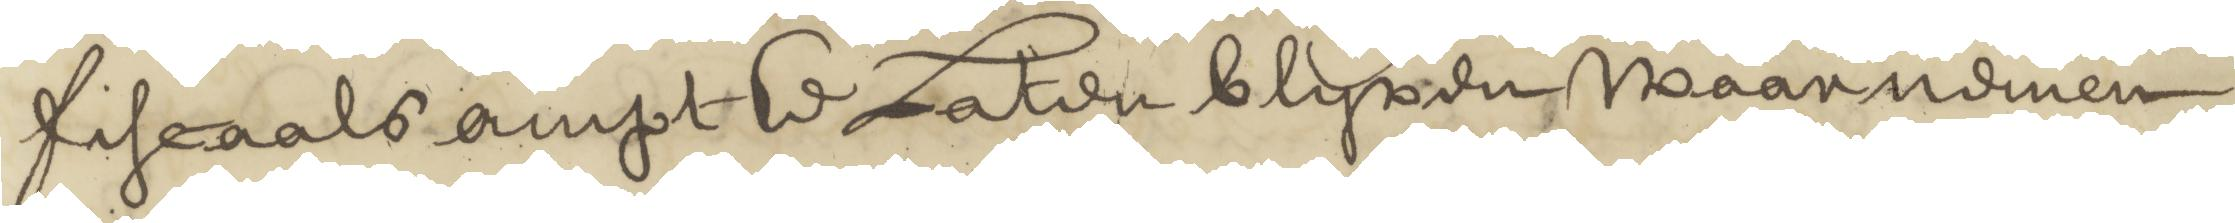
fiscaals ampt te Laten blijven waarnemen
